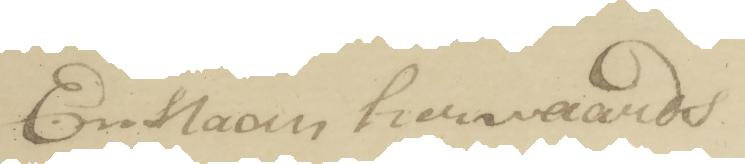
En staan herwaards
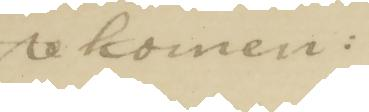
te komen:
